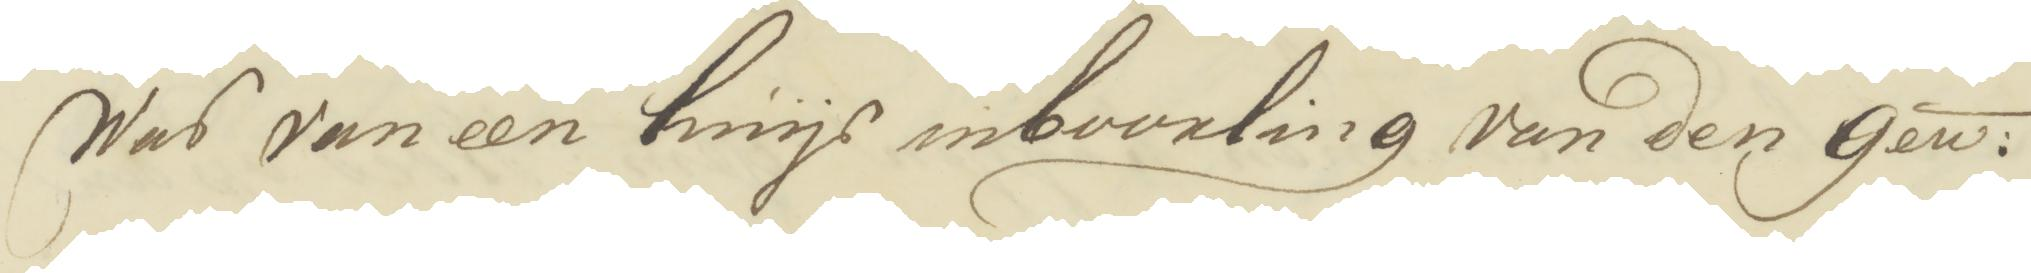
was van een huijs inboorling van den gew:
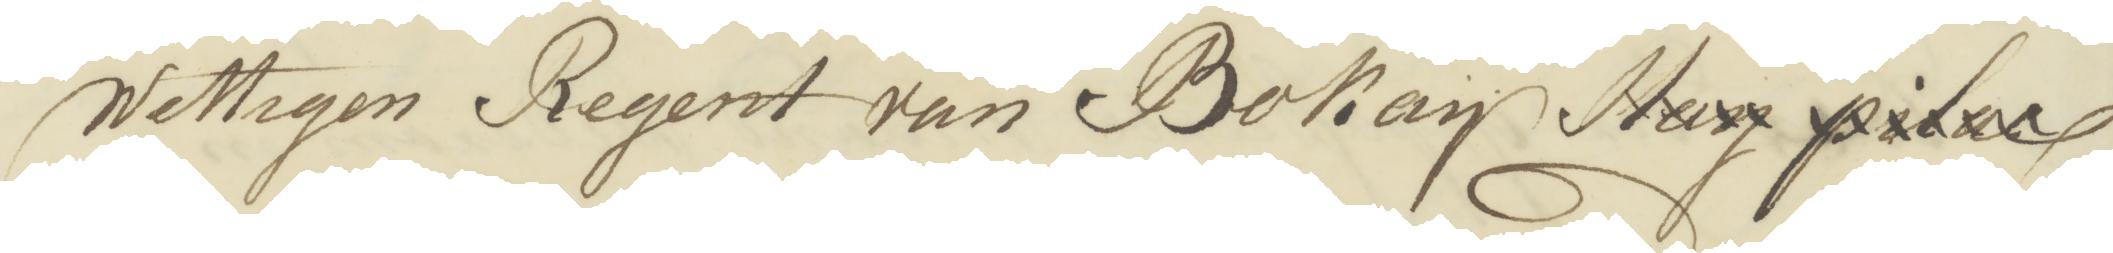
wettigen Regent van Bokaij Hay pilac
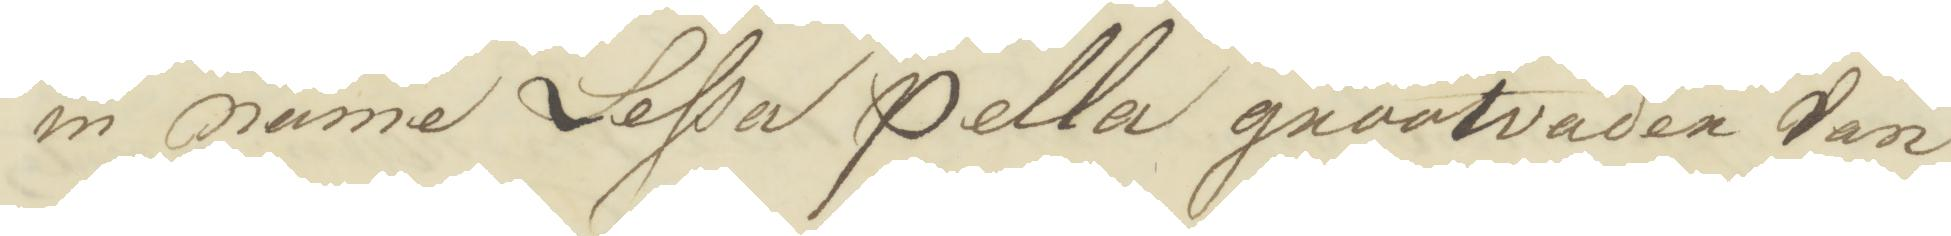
in name Sessa pella grootvader van
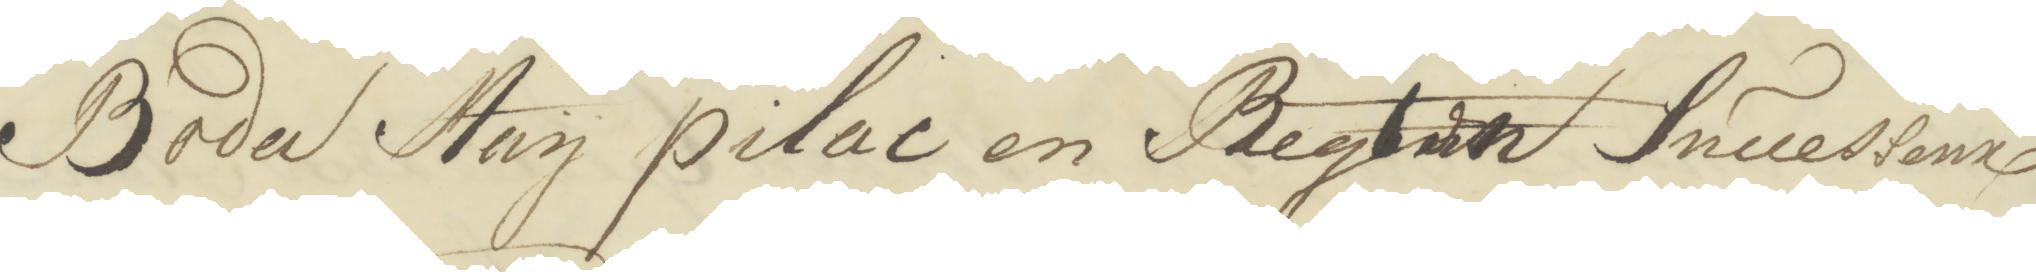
Boda Haij pilac en Regten successeur
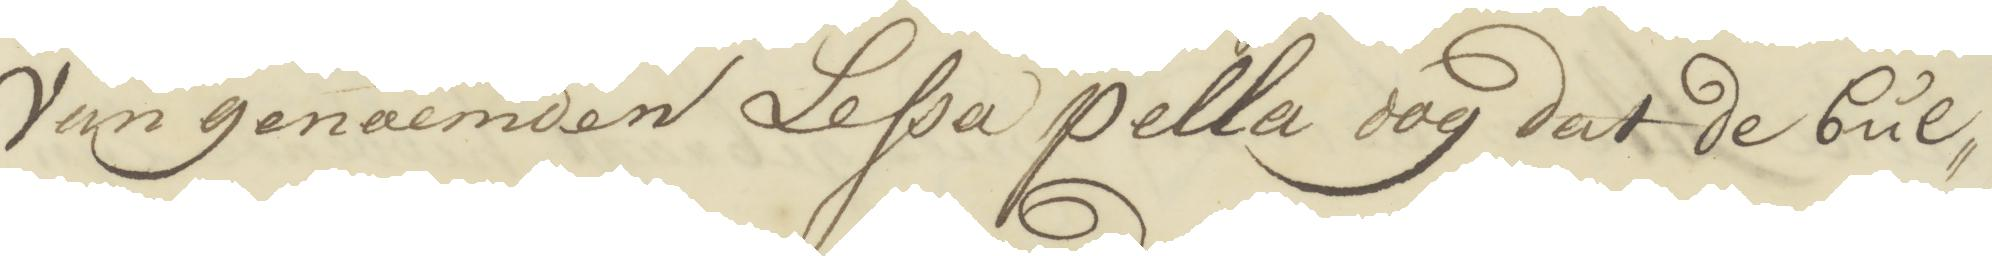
van genoemden Lessa pella dog dat de bul„
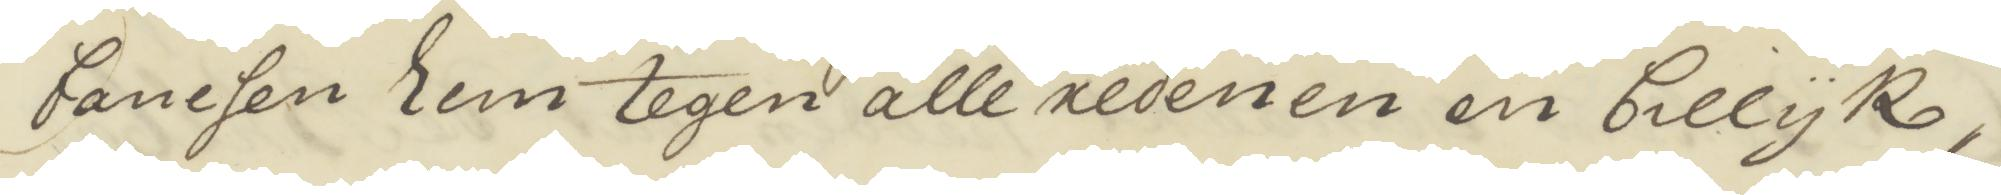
banesen hem tegen alle redenen en billijk„
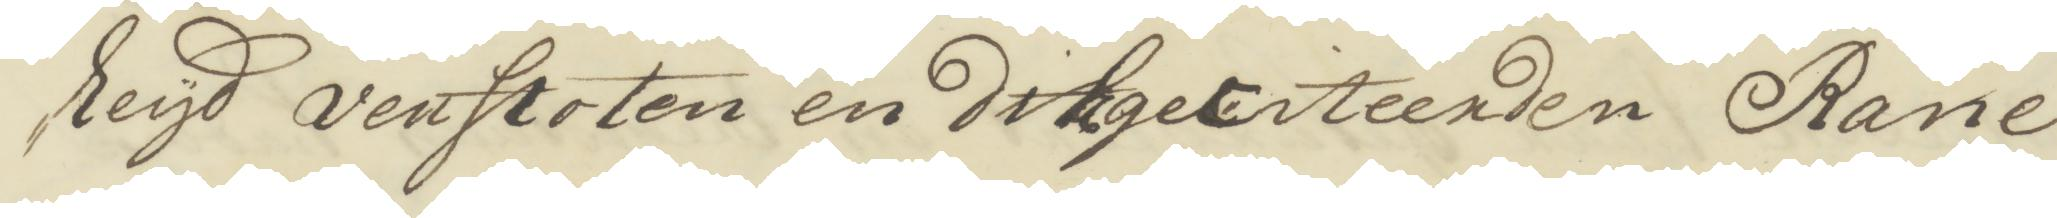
„heijd verstoten en dit geciteerden Rane
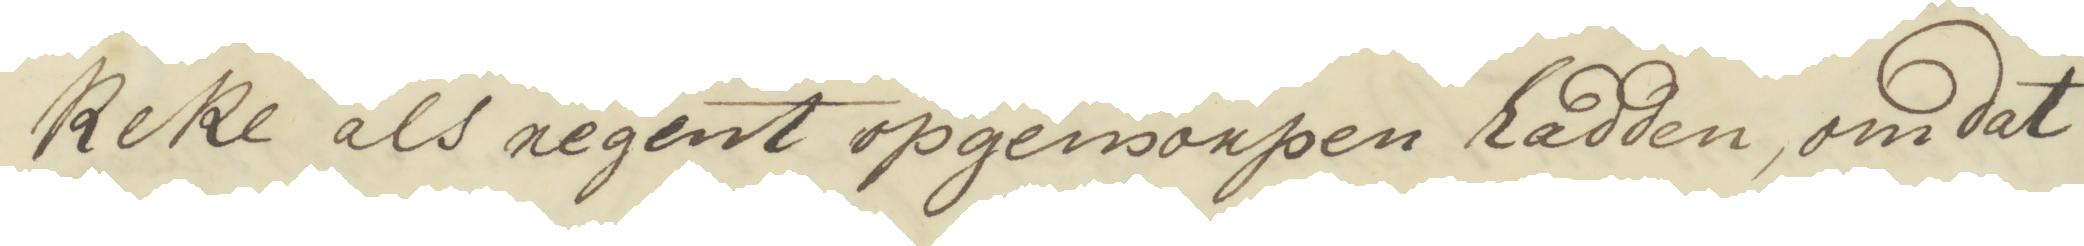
Keke als regent opgeworpen hadden, om dat
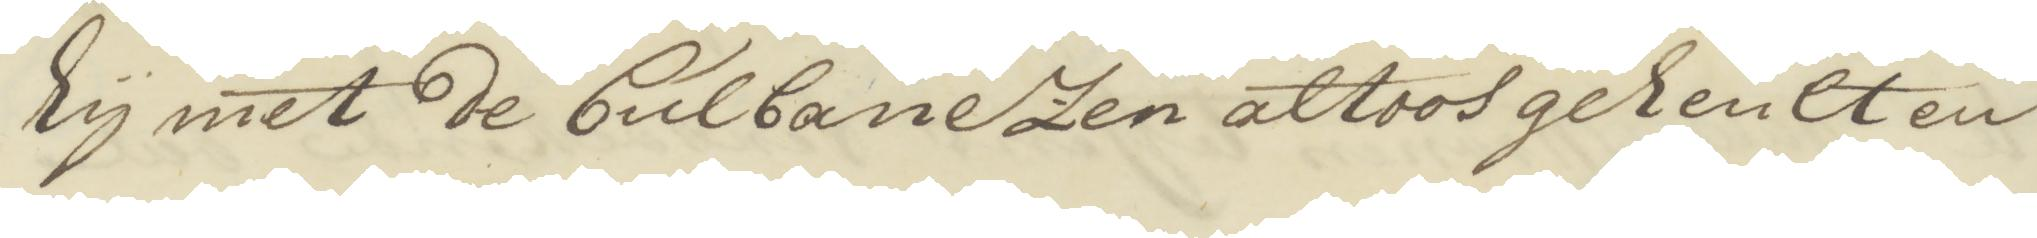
hij met de bulbanezen altoos geheult en
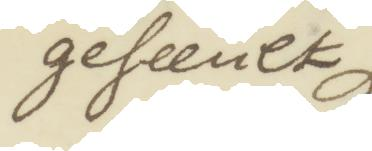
geseeult
